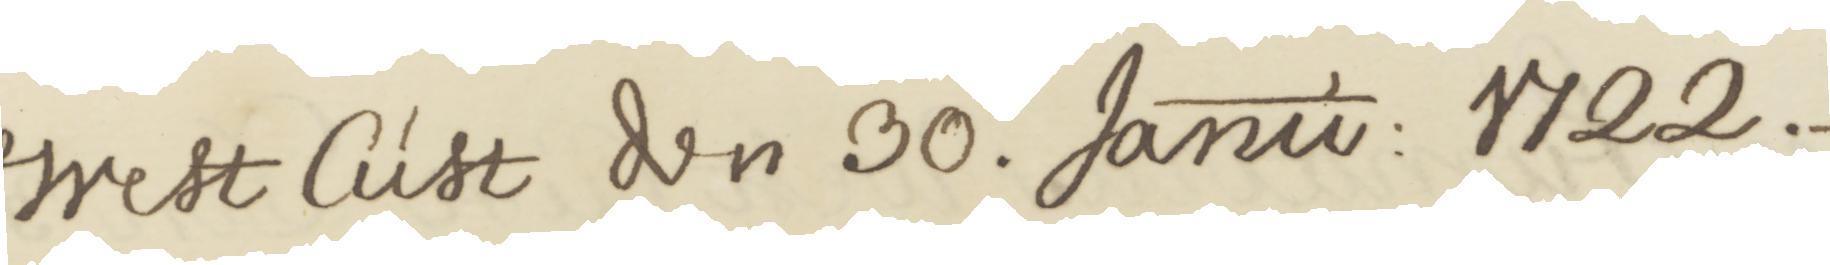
West Cust den 30. Janu: 1722.—
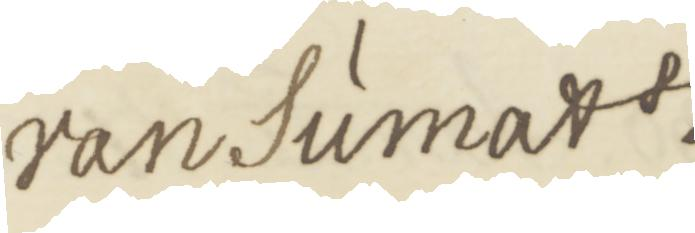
van Sumats
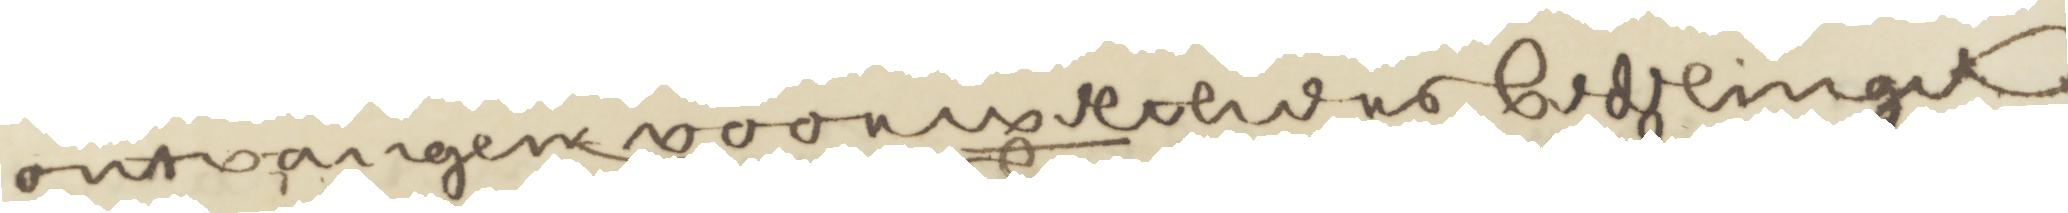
ontvangen voorwelckers bedelinge
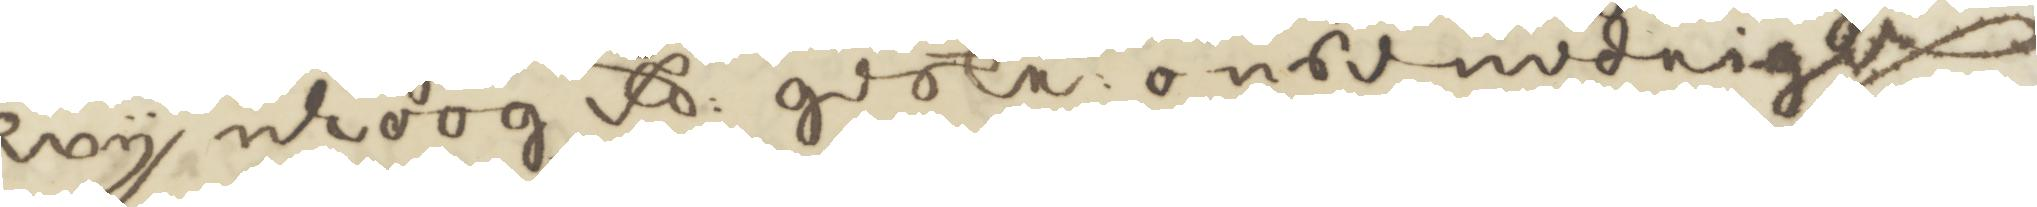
wij uhoog Ed: gestr: onse nedrighe
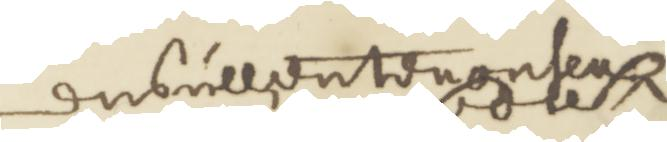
en sullen ter onser
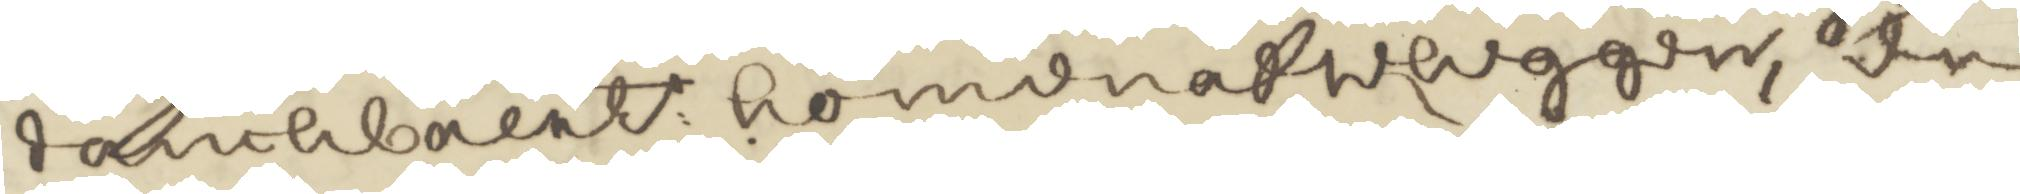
danckbaerh:t komen afteleggen, en
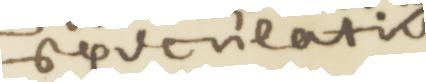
speculatie die
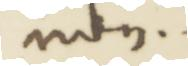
nen.
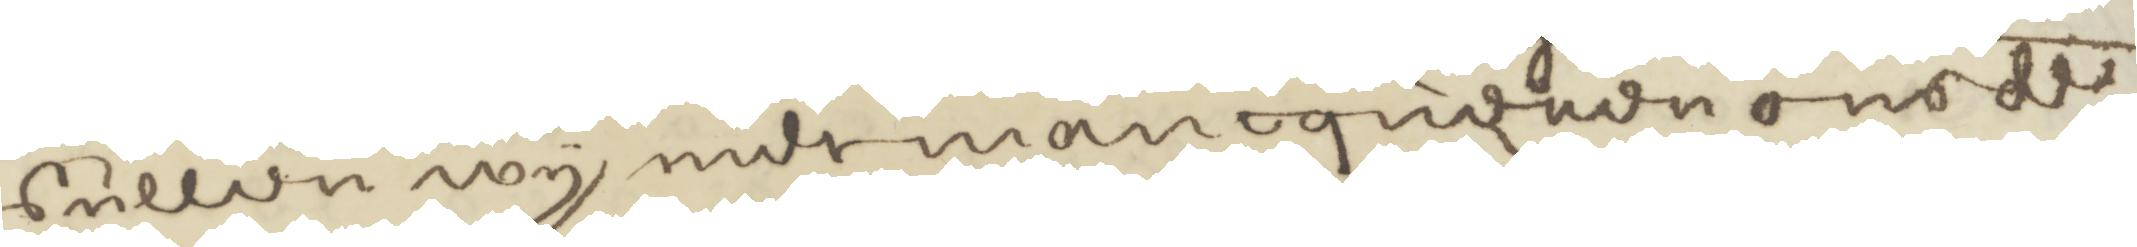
sullen wij niet mancqueren ons de
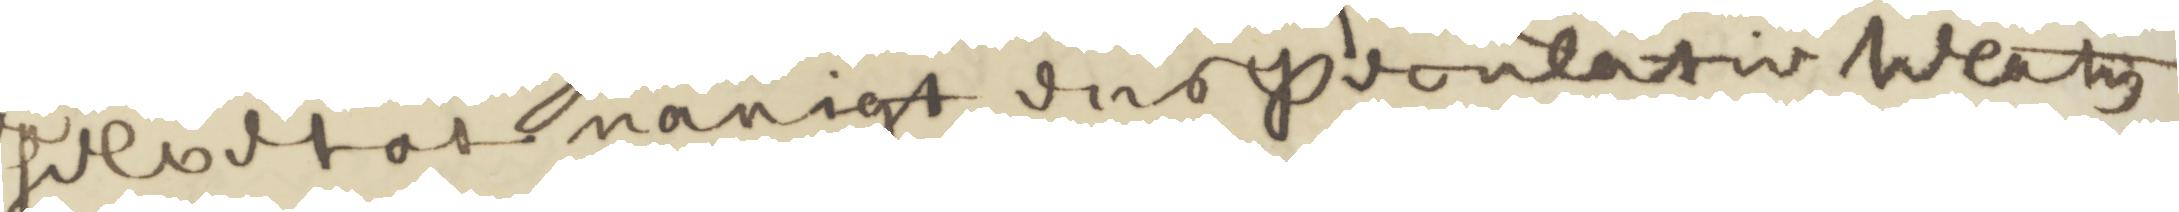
selve tot narigt en speculatie te laten
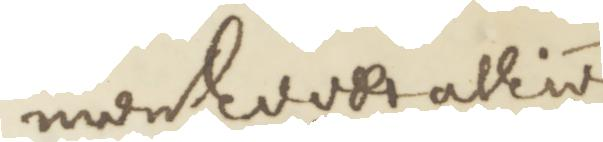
men heeft alhier
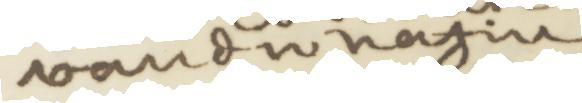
van den natien
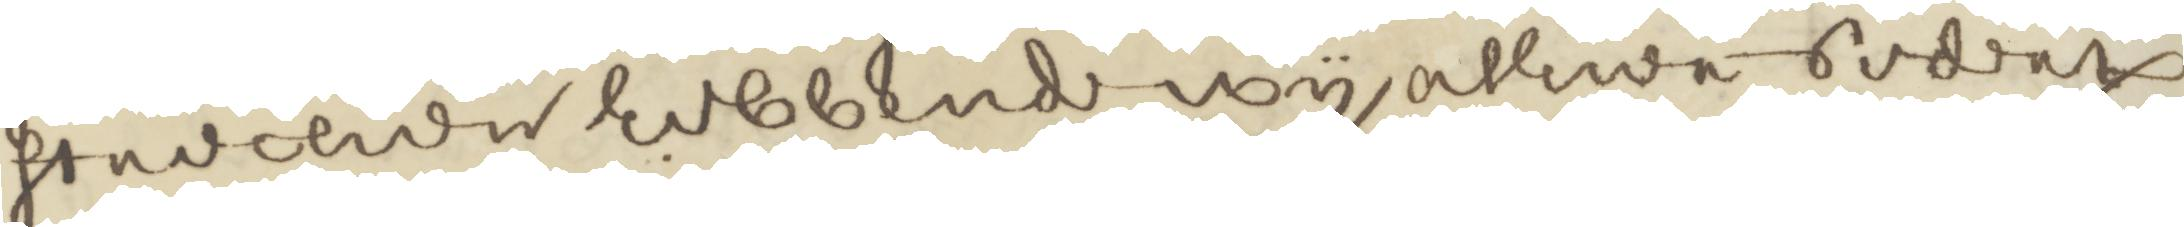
strecken hebbende wij alhier sedert
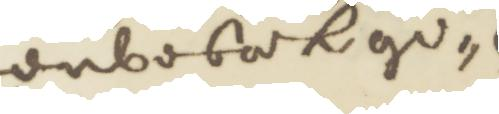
geen besoek ge„
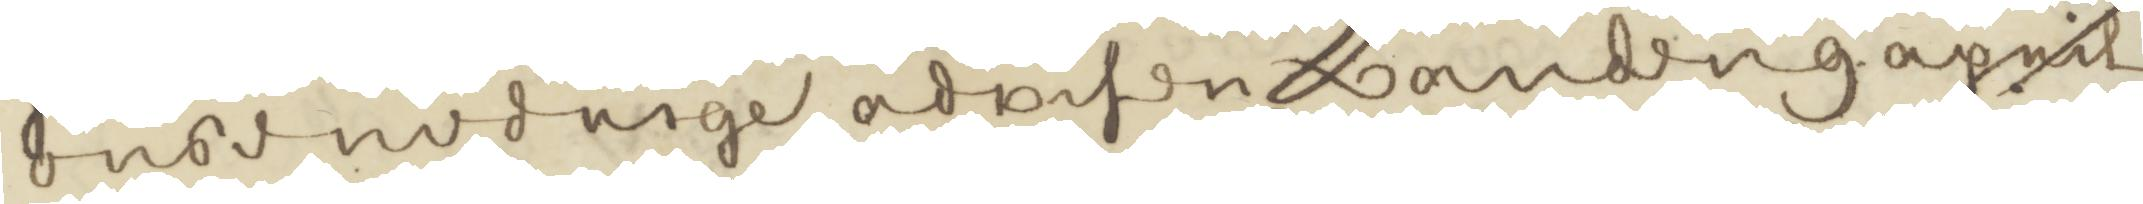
onse nedrige advisen vanden 9.april
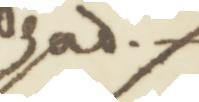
had.
